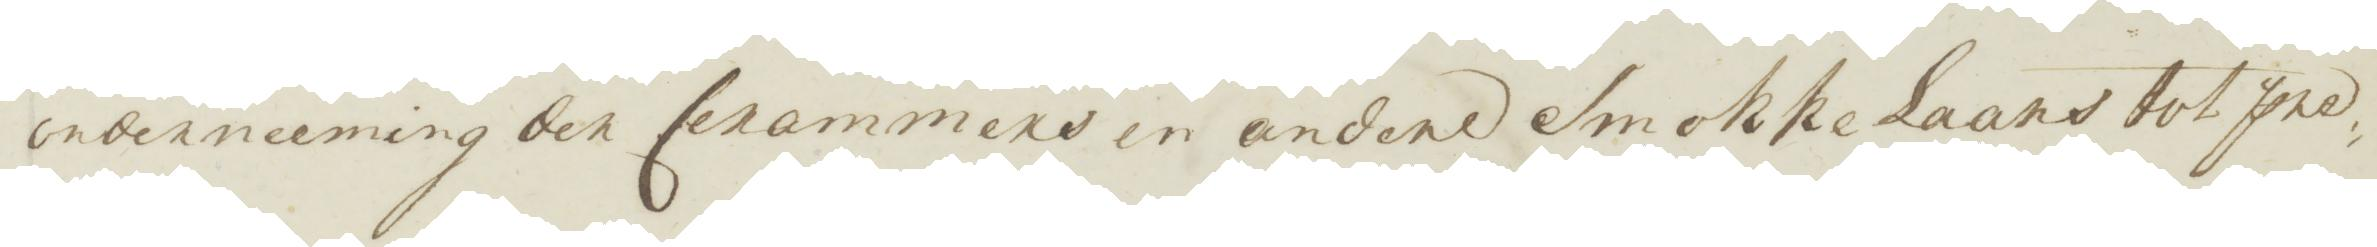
onderneeming der cerammers en andere smokkelaars tot pre„
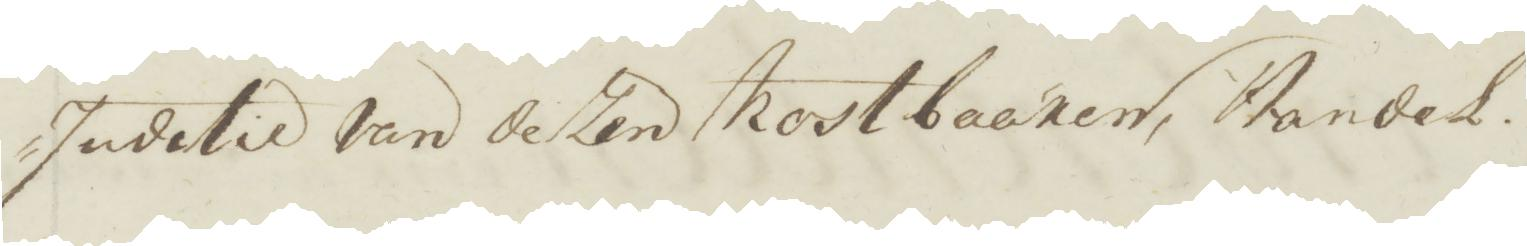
„juditie van dezen kostbaaren, Handel.
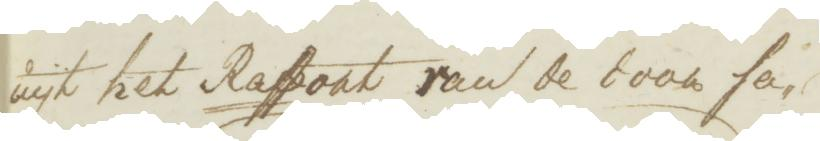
uijt het Rapport van de door sa„
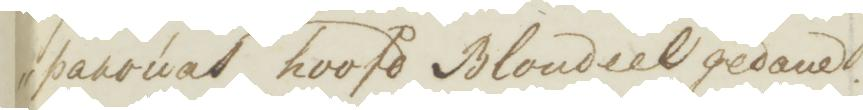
parouas hoofd Blondeel gedane
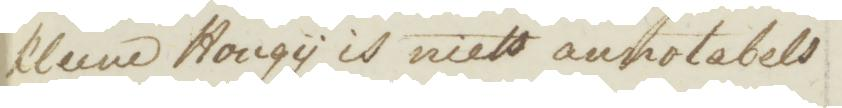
kleene Hongij is niets annotabels
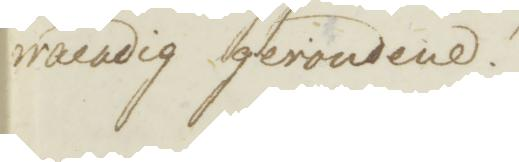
waerdig gevondene.
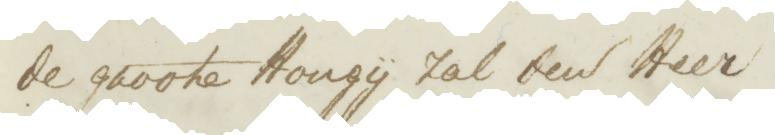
de groote Hongij zal den Heer
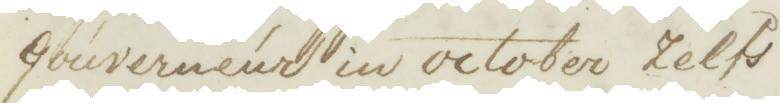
Gouverneur in october zelfs
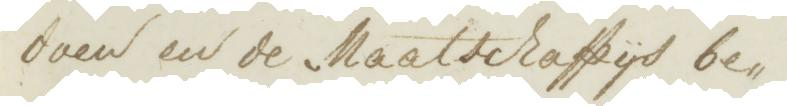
doen en de Maatschappijs be„
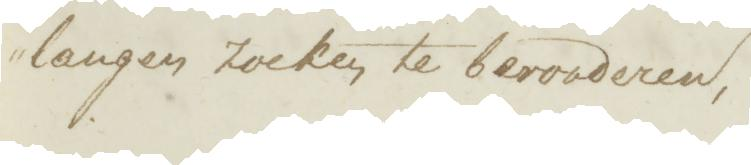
„langen zoeken te bevorderen,
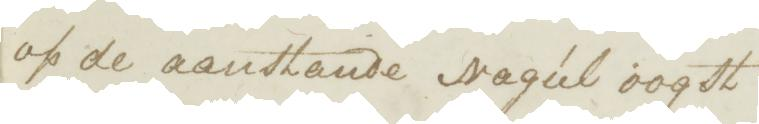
op de aanstande Nagul oogst
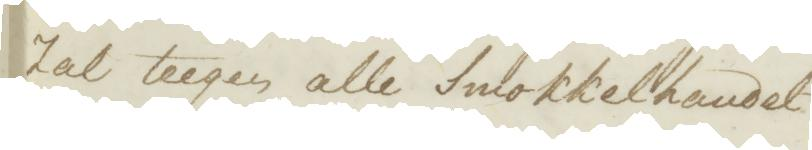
zal teegen alle smokkel handel
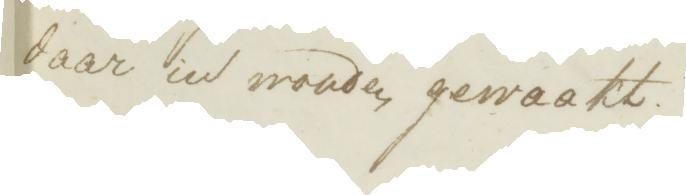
daar in worden gewaakt.
